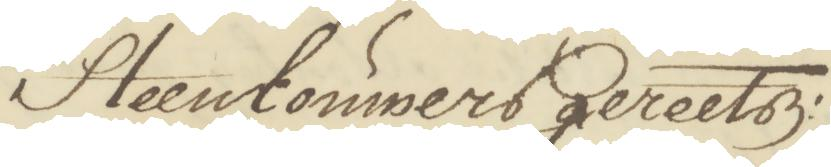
steenhouwers gereets:
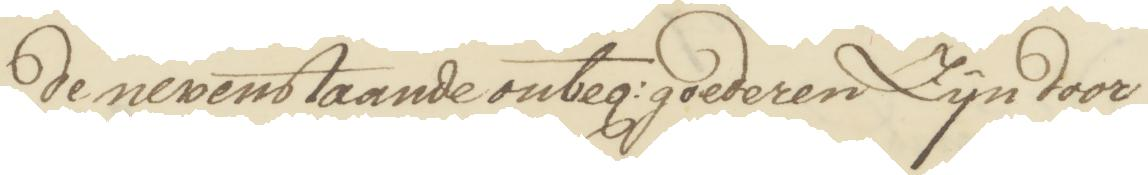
de nevenstaande onbeq: goederen zijn door
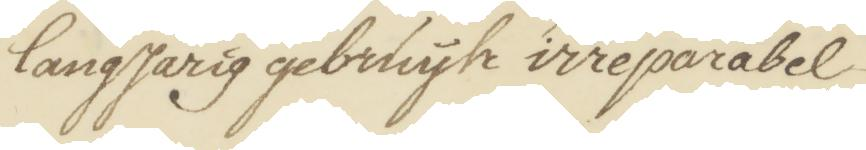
langjarig gebruijk irreparabel —
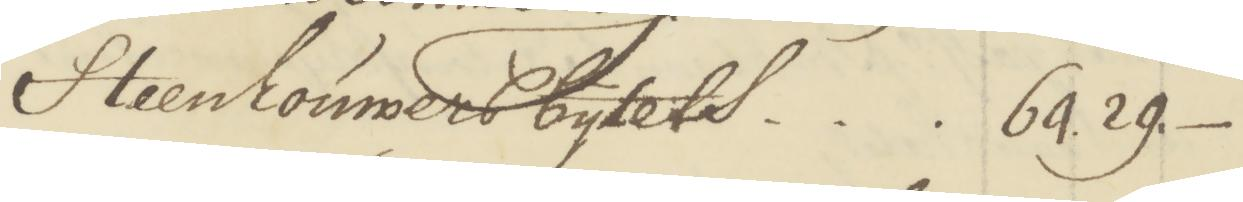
Steenhouwers bijtels - - - 64. 29. —
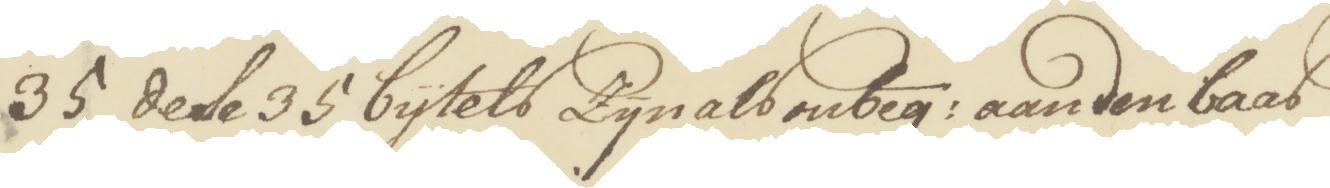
35 dese 35 bijtels zijn als onbeq: aan den baas
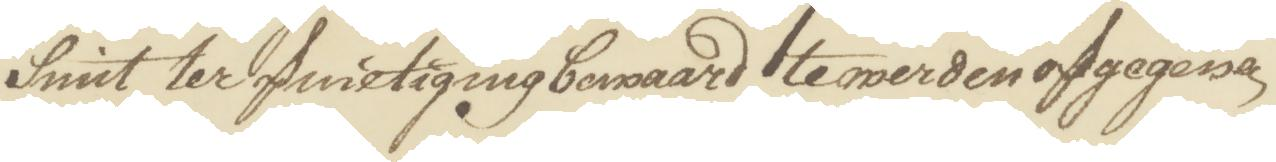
smit ter vernietiging bewaard te werden overgegeven
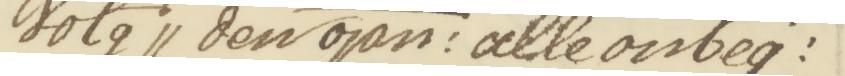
volg„s den opn: alle onbeq:
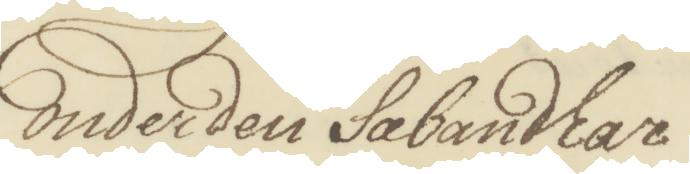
onder den sabandhar
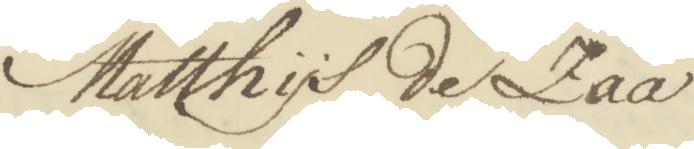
Matthijs de Zaa
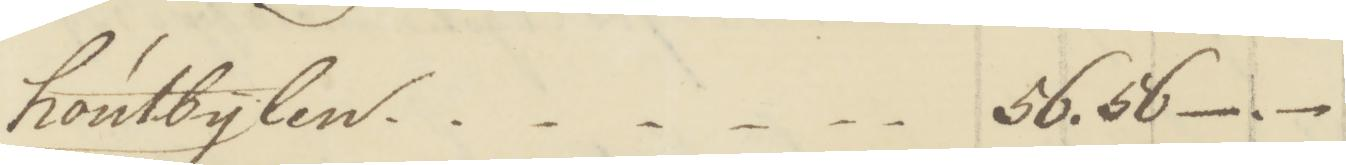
houtbijlen - - - - - - - 56. 56 —. —
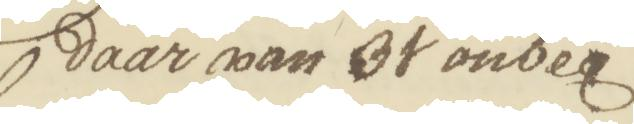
daar van 31 onbeq
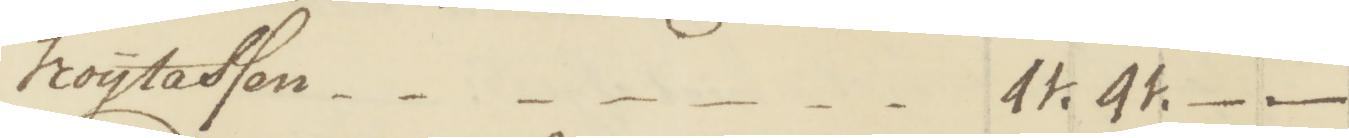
koijtassen - - - - - - - 41. 41. —. —
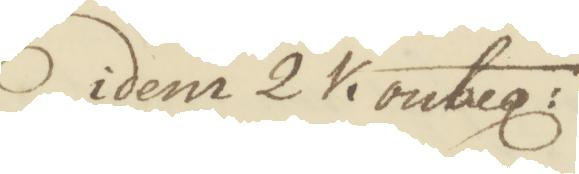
idem 21. onbeq:
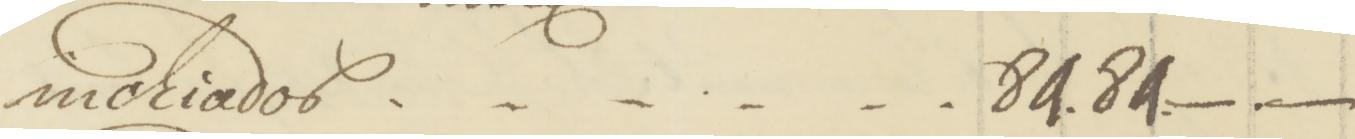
inchiados - - - - - - 84. 84. —. —
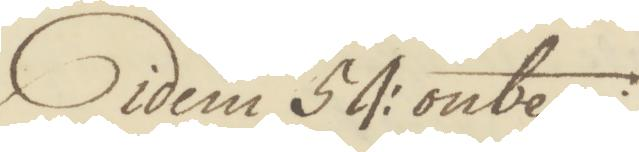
idem 54: onbeq:
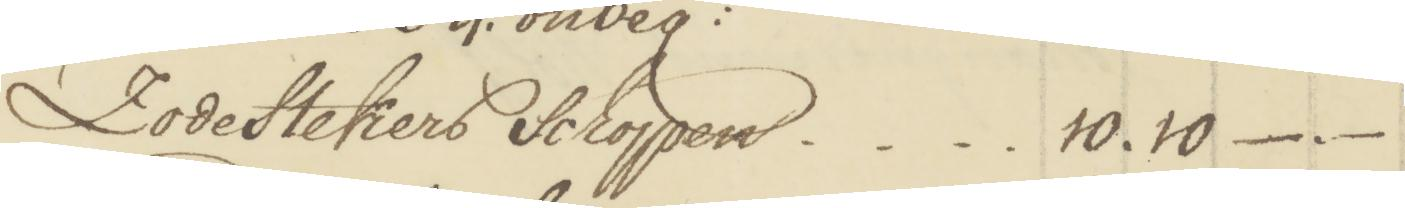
Zodestekers schoppen - - - - 10. 10 —. —
